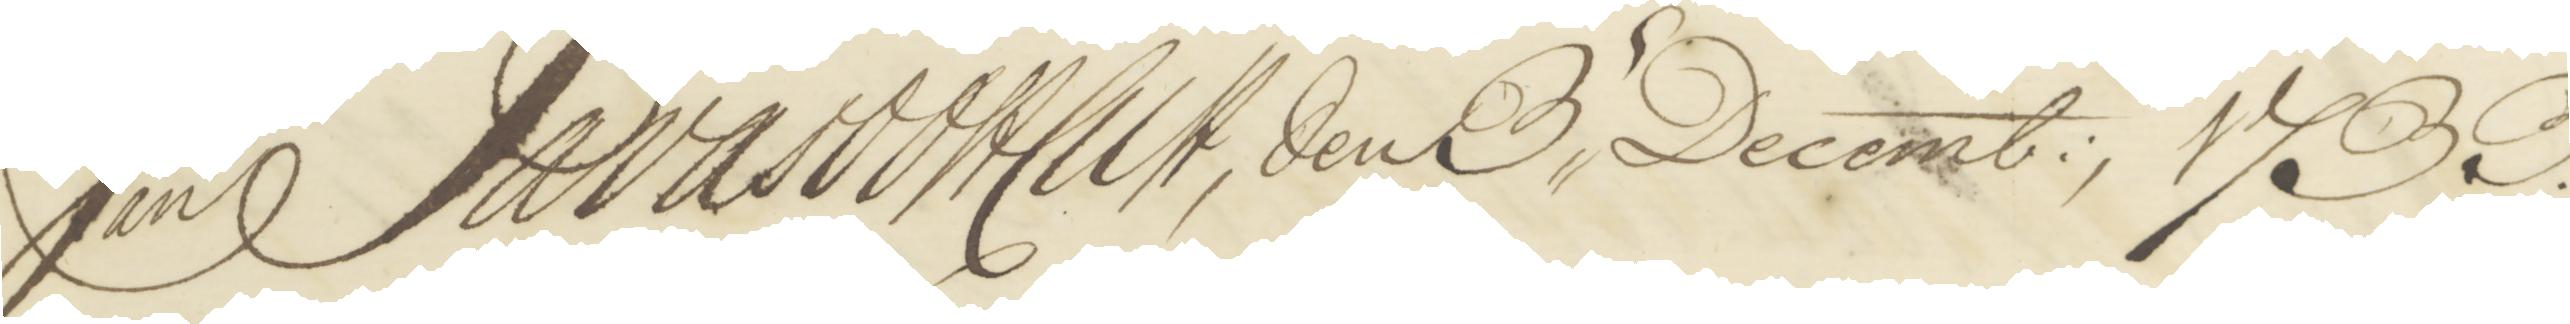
Van JavasoostCust, den 3„' Decemb:, 1733
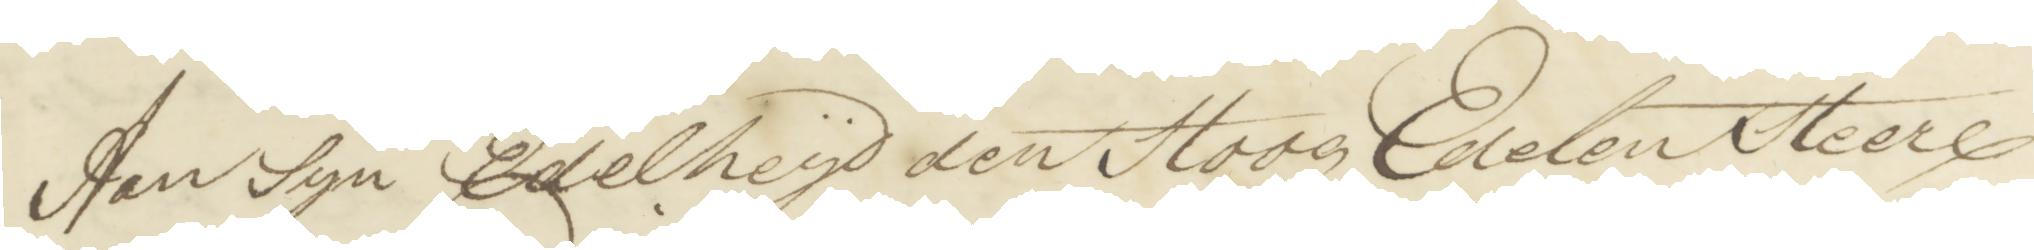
Aan sijn Edelheijd den Hoog Edelen Heere
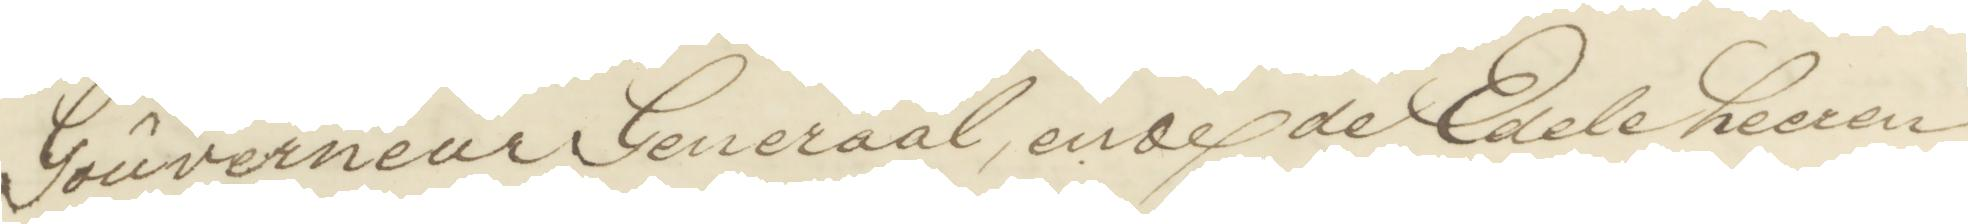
Gouverneur Generaal, ende de Edele heeren
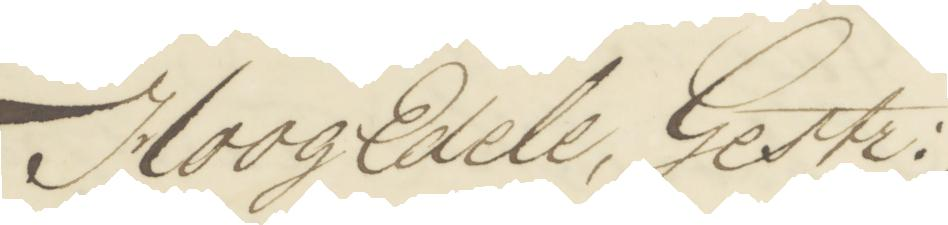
Hoog Edele, Gestr:
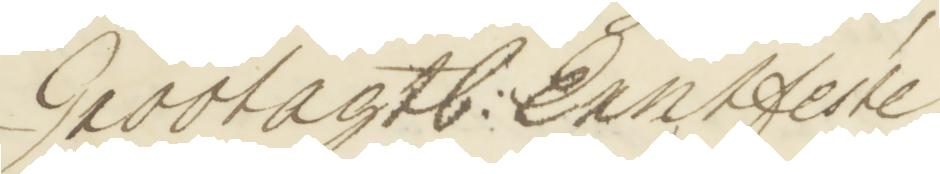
Groot agtb: Erntfeste
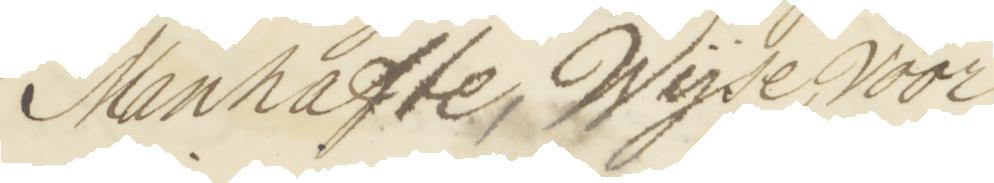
Manhafte, Wijse, voor
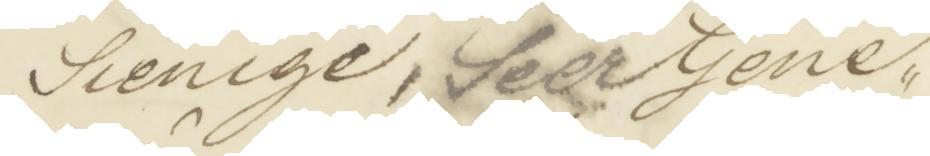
sienige, seer Gene„
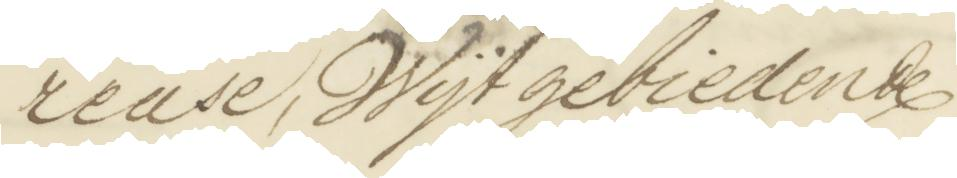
reuse, Wijt gebiedende
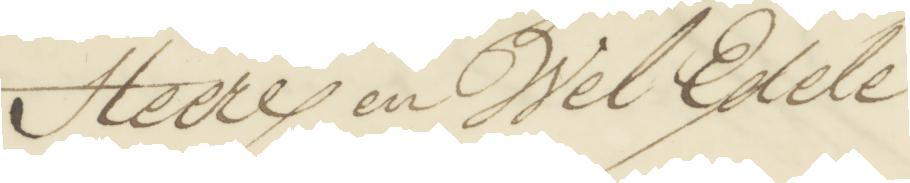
Heere en Wel Edele
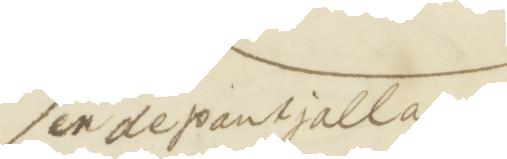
Per de pantjallang
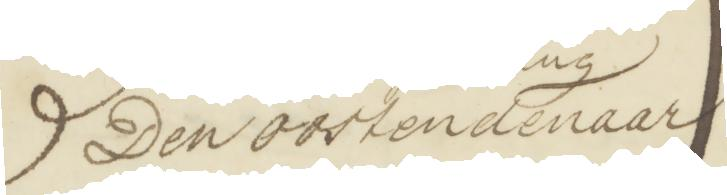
Den oostendenaar
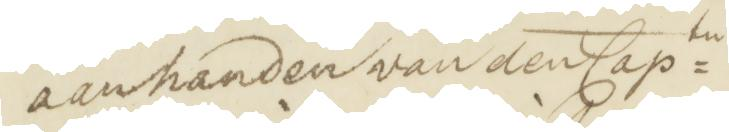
aanhanden van den Cap=tn
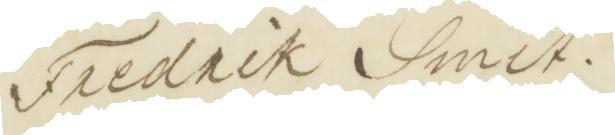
Fredrik Smit.
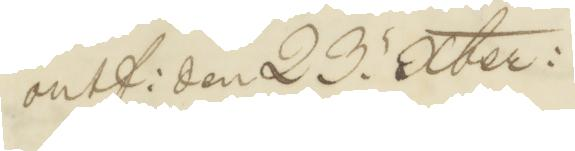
ontf: den 23.' xber:
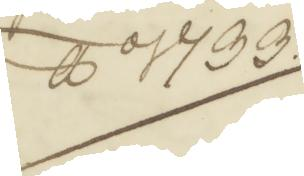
Ao 1733
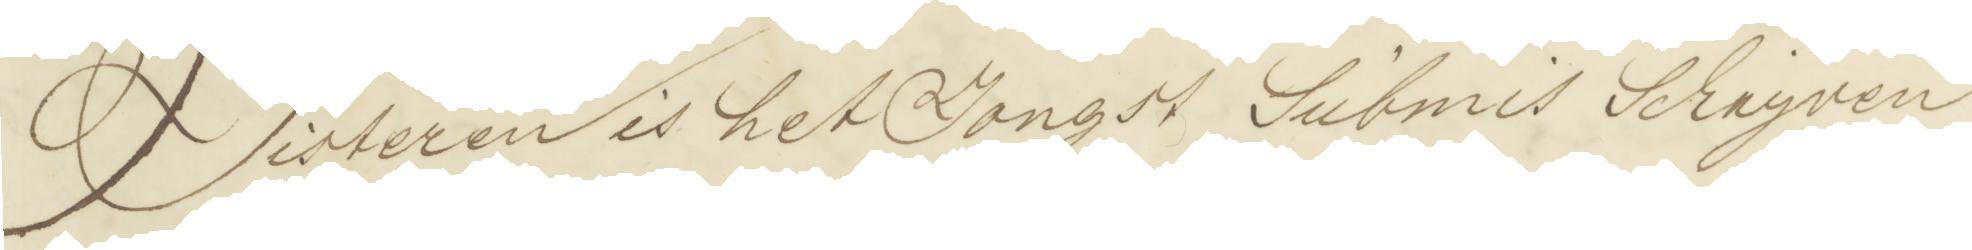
Gisteren is het Jongst submis schrijven
